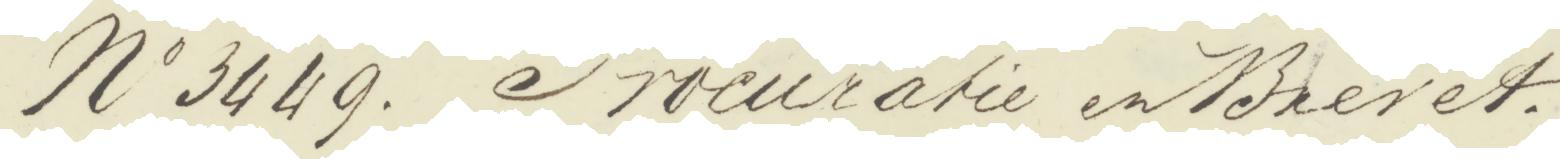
No 3449. Procuratie en Brevet.
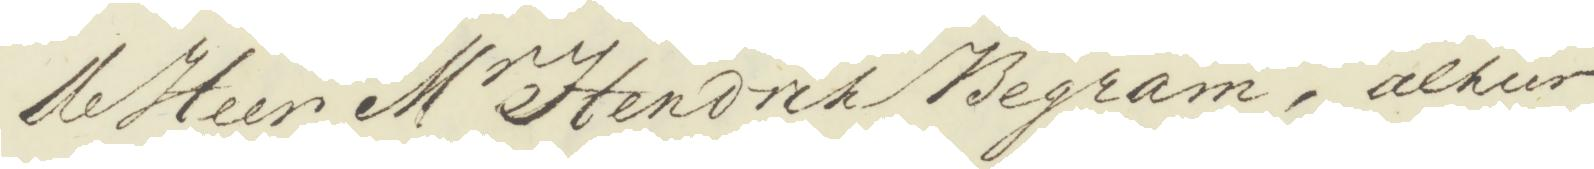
de Heer Mr Hendrik Begram, alhier
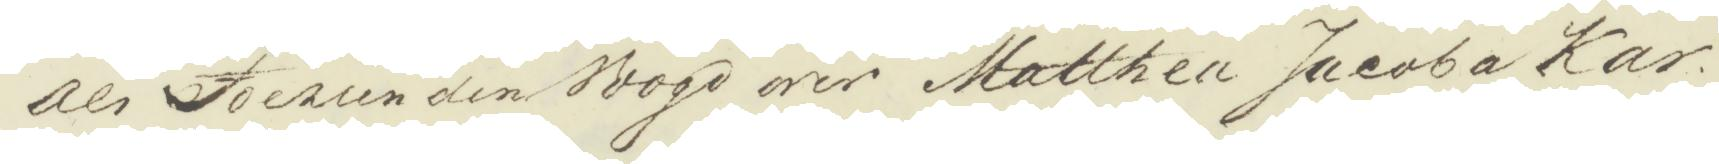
als Toezien den voogd over Mattheu Jacoba Kar.
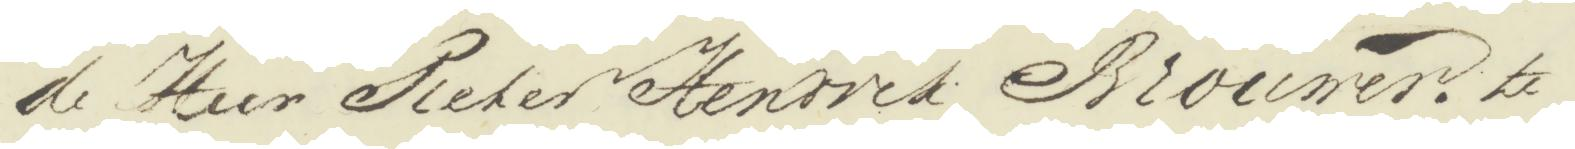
de Heer Pieter Hendrik Brouwer. te
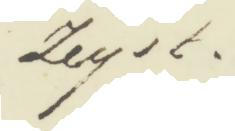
zeyst.
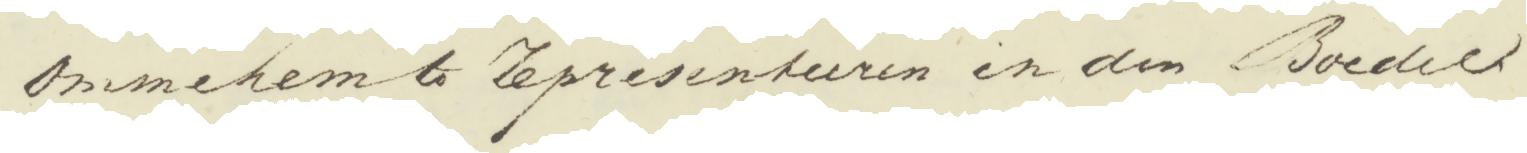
ommehem te representeeren in den Boedel
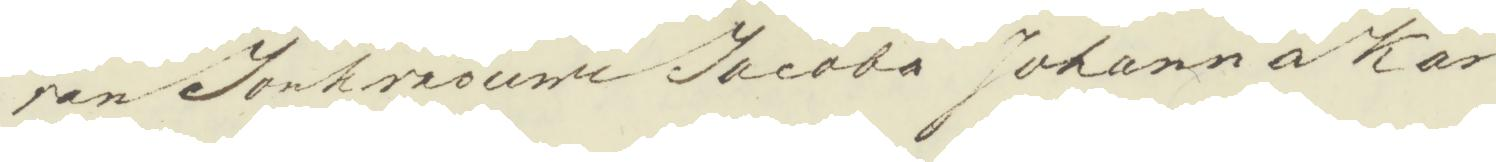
van Jonkvrouwe Jacoba Johanna Kar
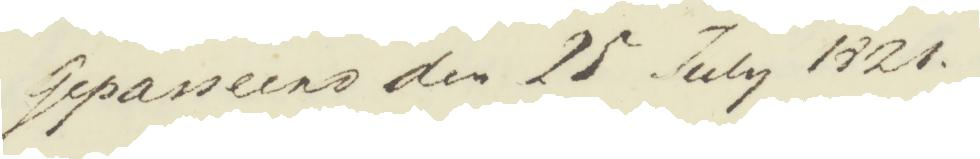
Gepasseerd den 25 July 1821.
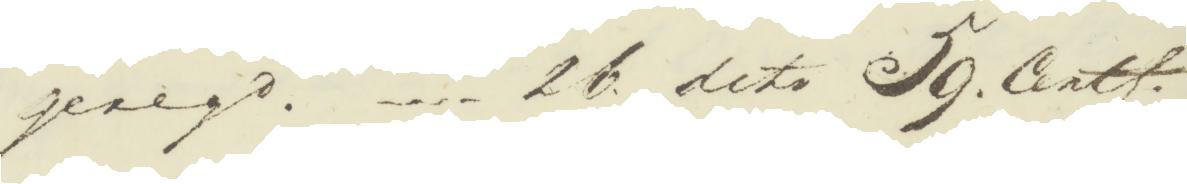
geregd. - - - - 26. dito 59. Cents.
